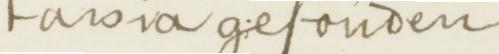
tavia gesonden
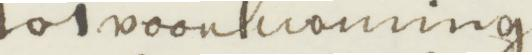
tot voorkoming
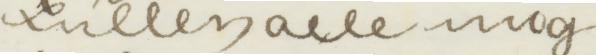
zullen alle mog
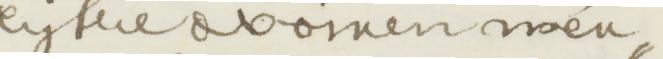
lijke dvoiren wer„
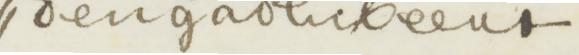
„den g'adhibeert
